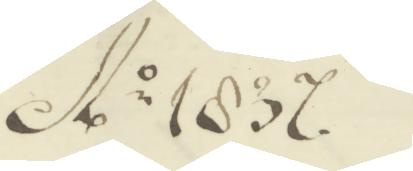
N:o 1837.
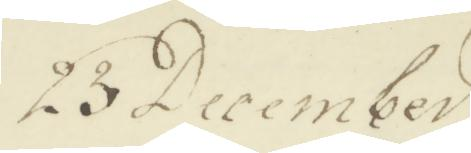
23 December
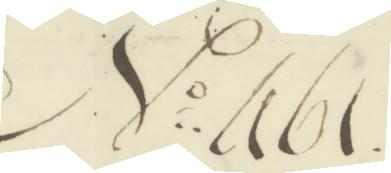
N:o 461.
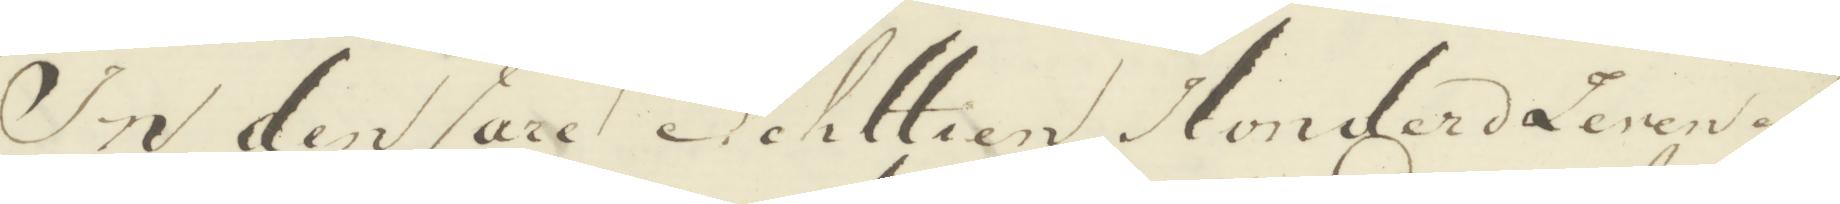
In den Jare Achttien Honderd Zeven en
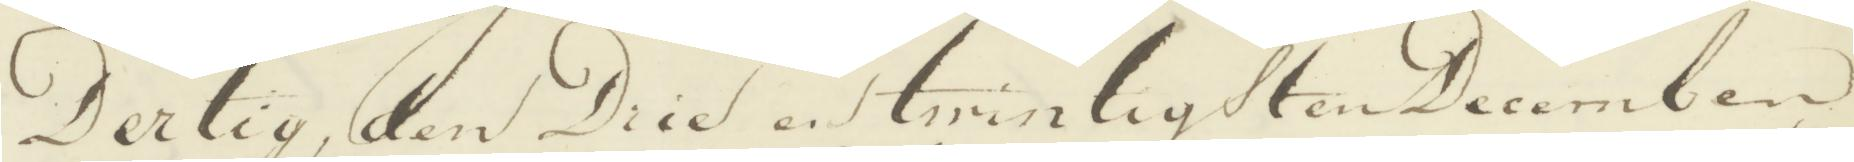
Dertig, den Drie en twintigsten December
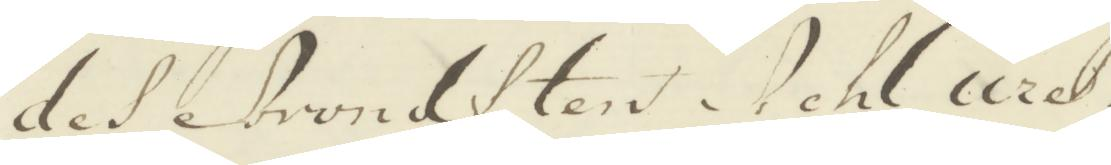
des Avonds ten Acht ure
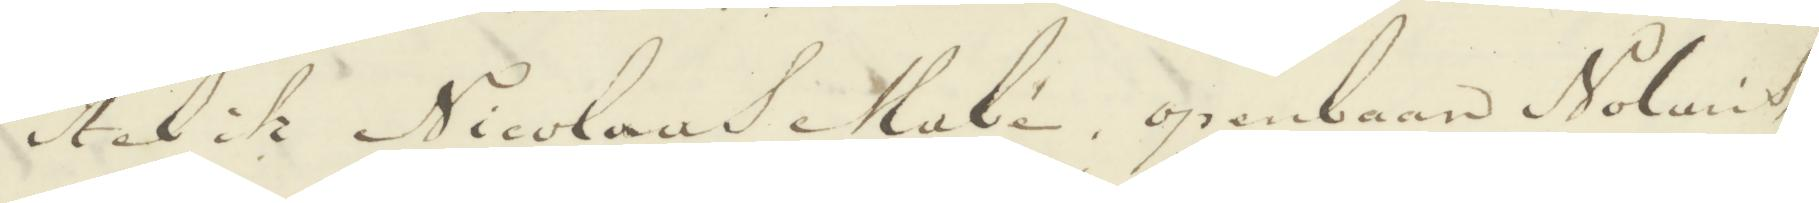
Heb ik Nicolaas Mabé, openbaar Notaris,
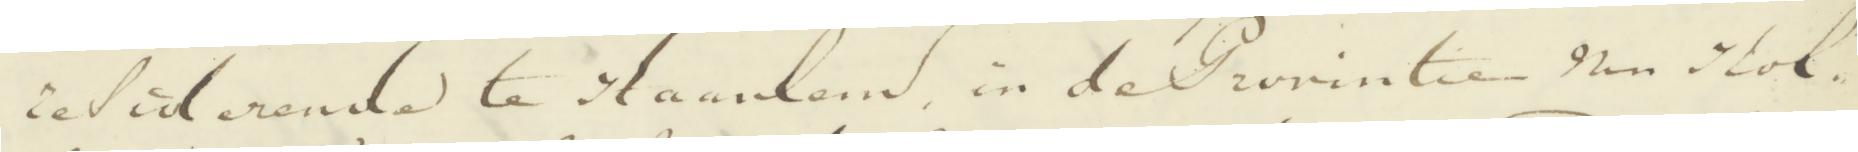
residerende te Haarlem, in de Provintie van Hol„
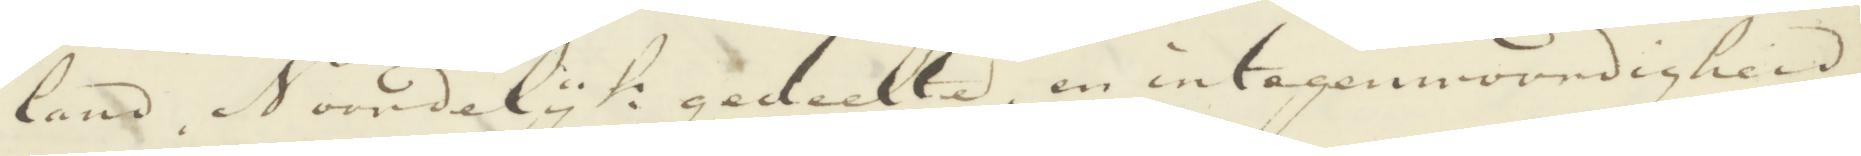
land, Noordelijk gedeelte, en in tegenwoordigheid
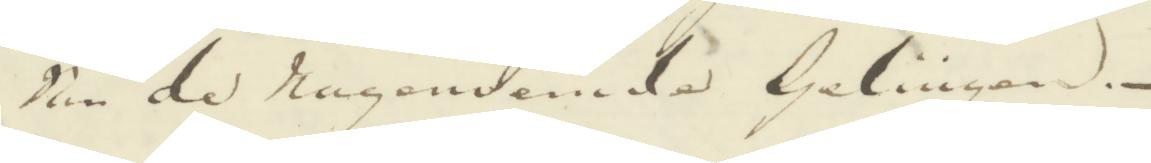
van de nagenoemde Getuigen.-
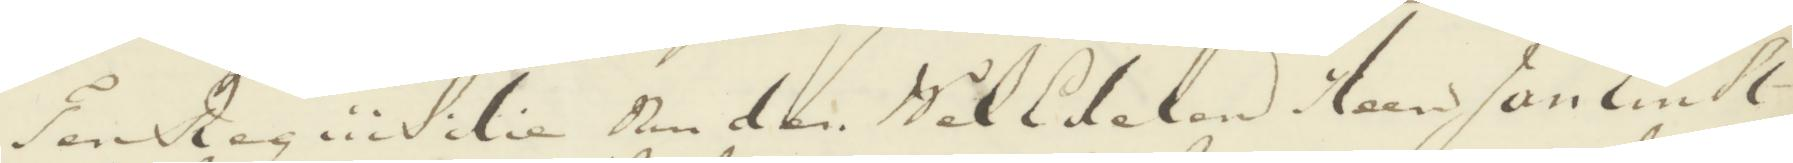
Een Requisitie van den Wel Edelen Heer Jan Ernst
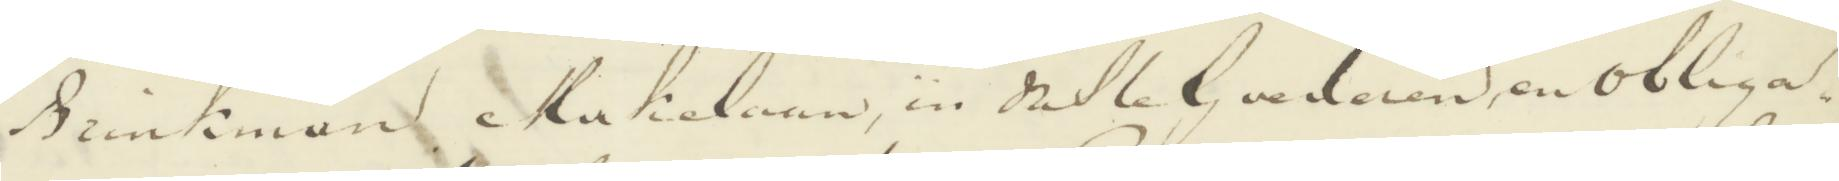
Brinkman Makelaar, in vaste Goederen, en obliga„
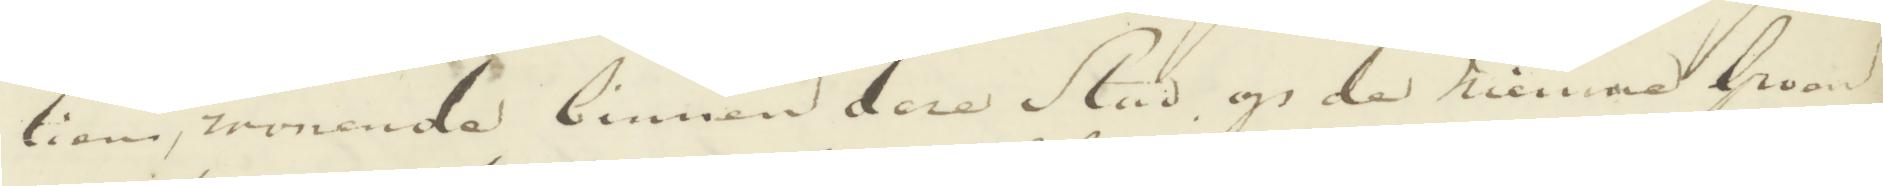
tien, wonende binnen deze stad, op de Nieuwe Groen
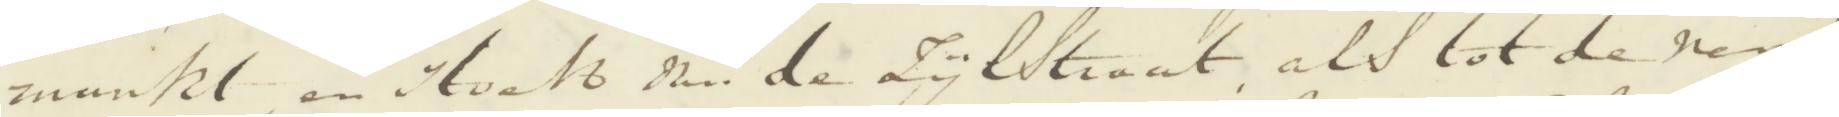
markt en Hoek van de Zijlstraat, als tot de ver
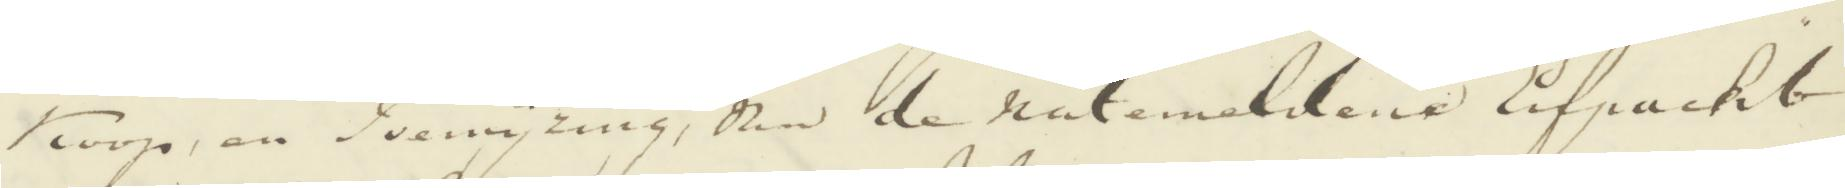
koop, en Toewijzing, van de natemeldene Erfpacht
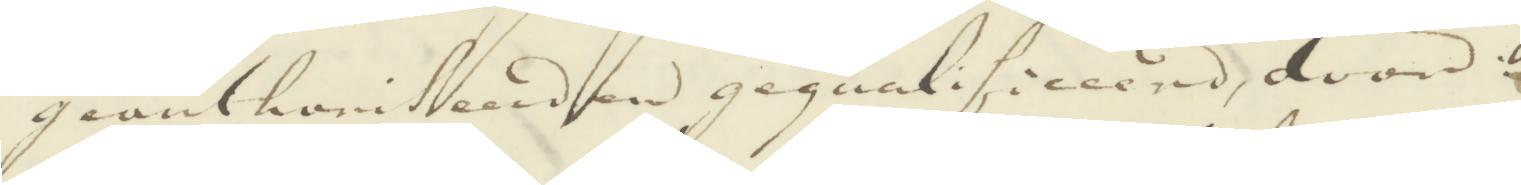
geäuthoriseerd en gequalificeerd, door:
